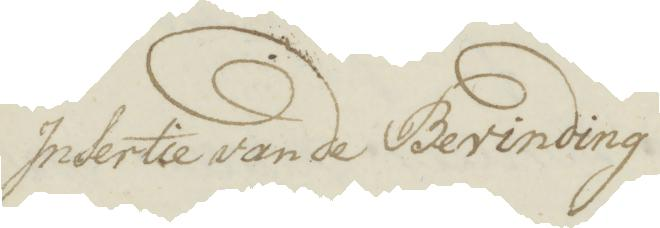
Insertie van de Bevinding
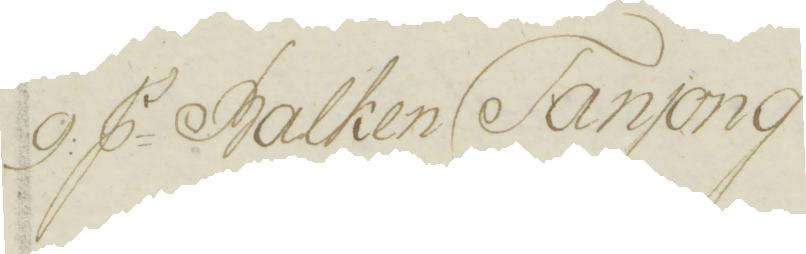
9: p=s Balken Tanjong
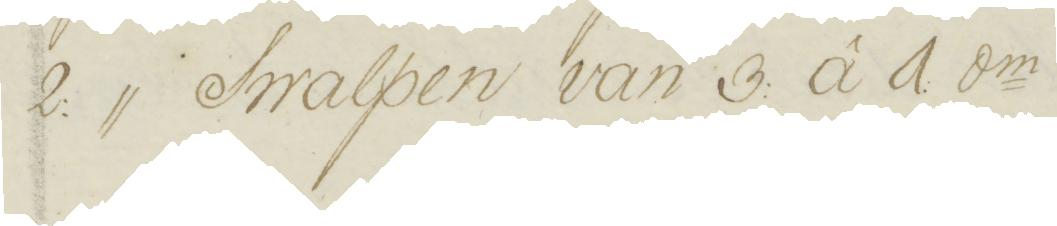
2: „ Swalpen van 3: â 4. d=m
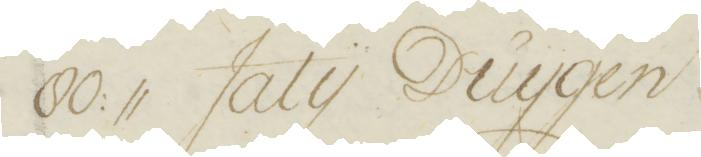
80: „ Jatij Duijgen
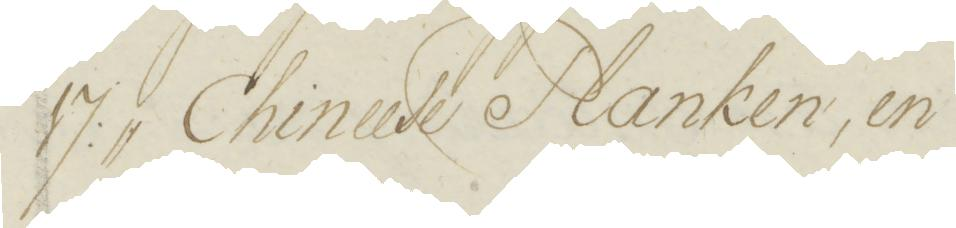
17: „ Chineese Planken, en
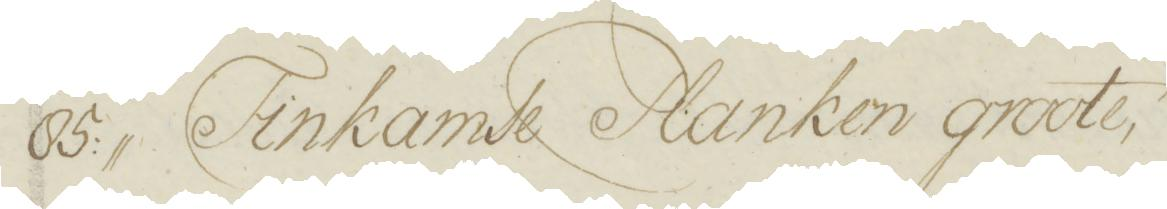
85: „ Tinkamse Planken groote,
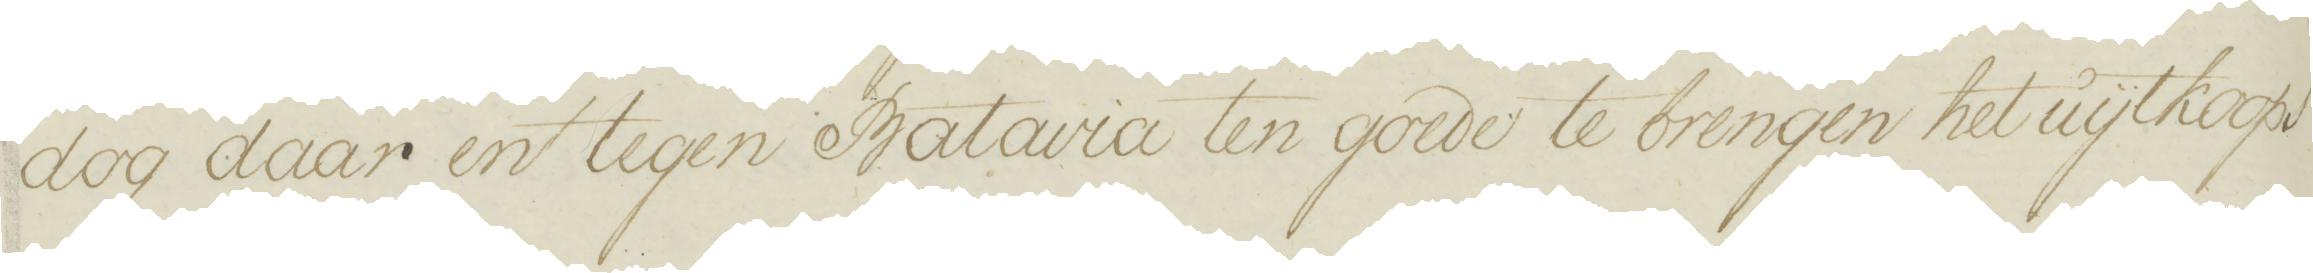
dog daar en tegen Batavia ten goede te brengen het uijtkoops
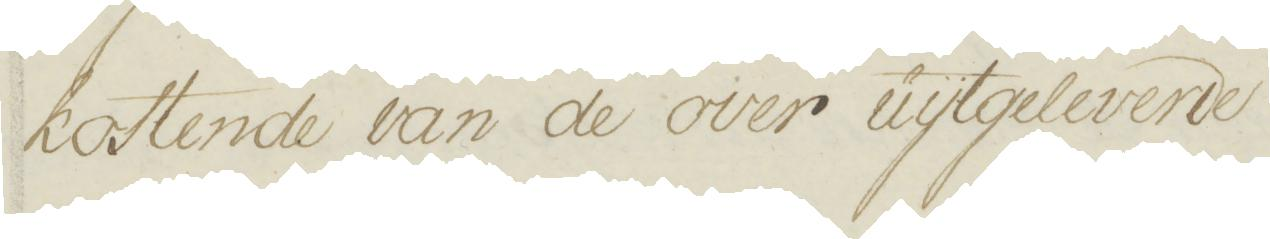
kostende van de over uijtgeleverde
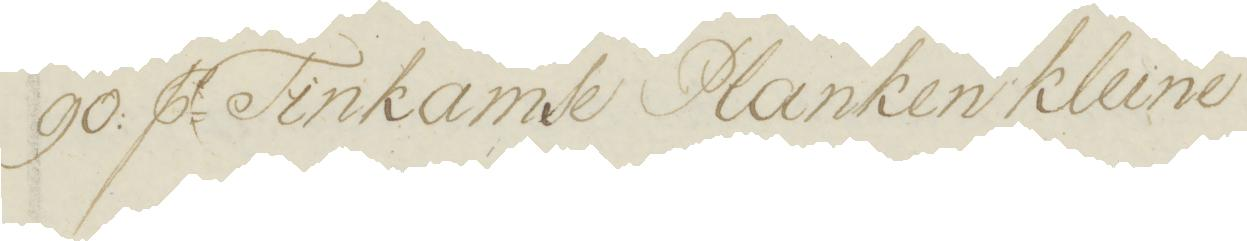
90: p=s Tinkamse Planken kleine
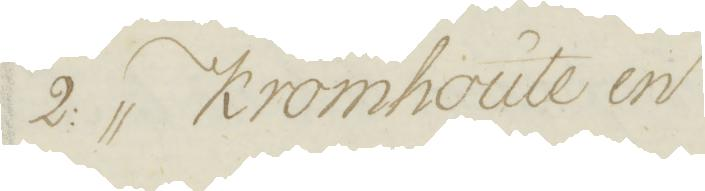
2: „ Kromhoute en
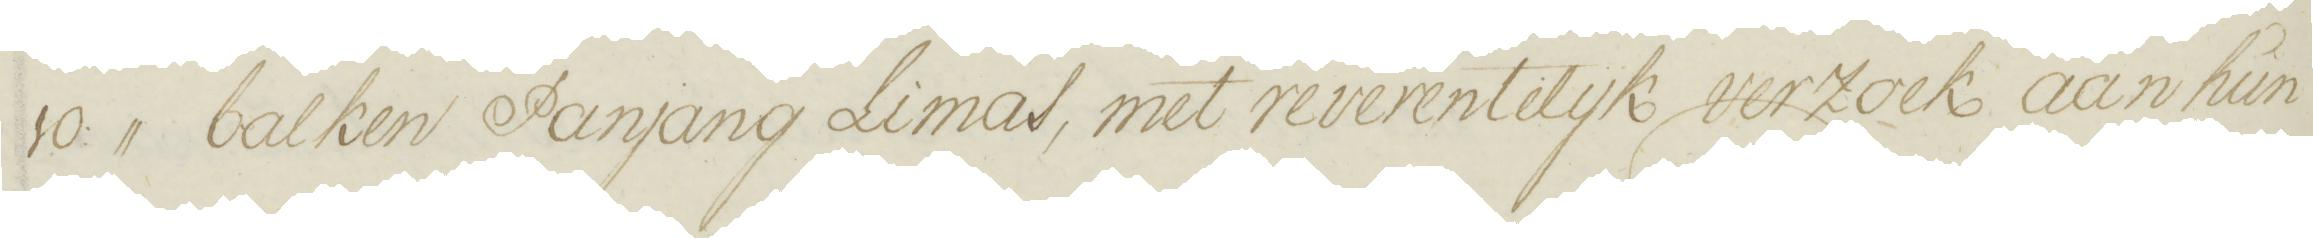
10: „ balken Panjang Limas, met reverentelijk verzoek aan hun
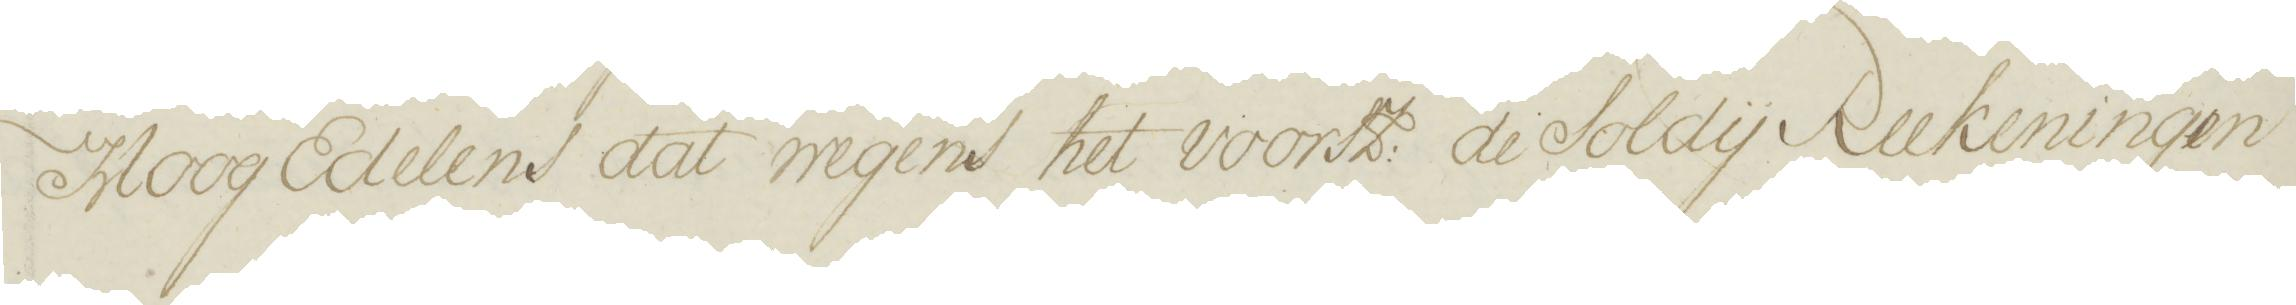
Hoog Edelens dat wegens het voorsz: de soldij Reekeningen
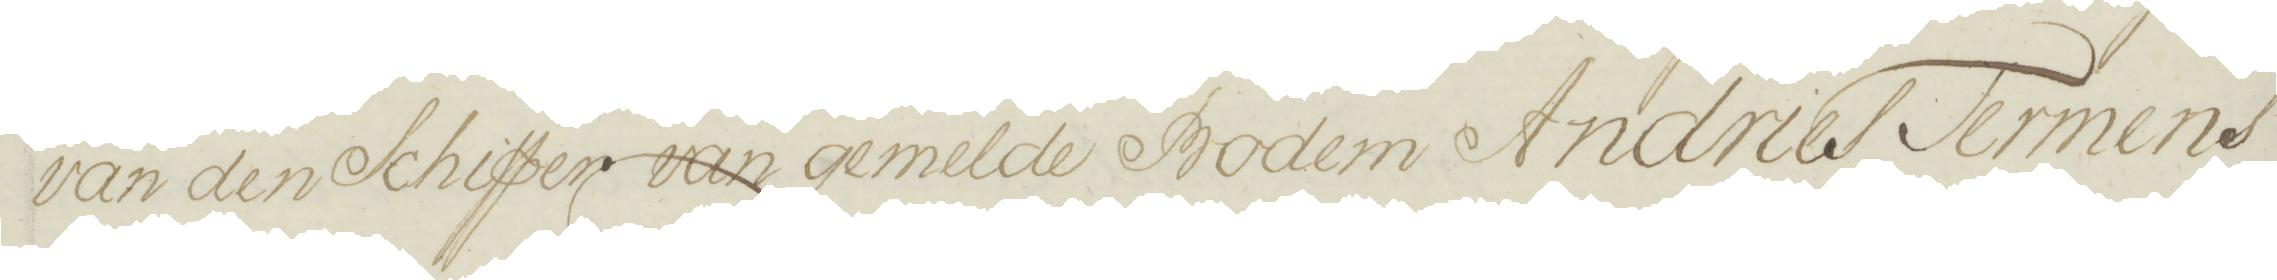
van den schipper van gemelde Bodem Andries Termens
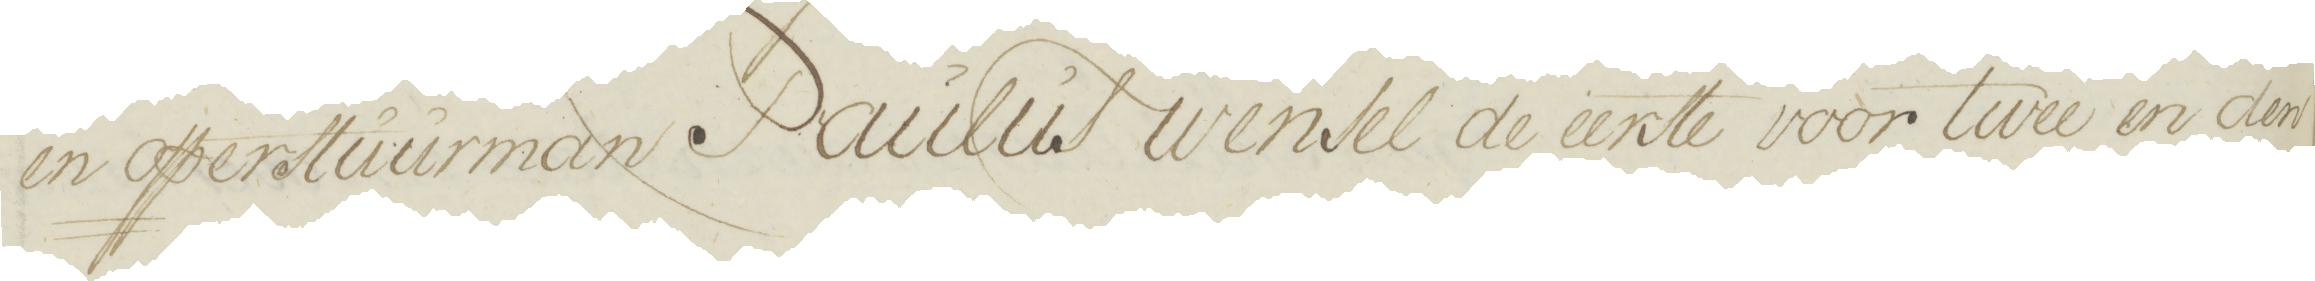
en opperstuurman Paulus Wensel de eerste voor twee en den
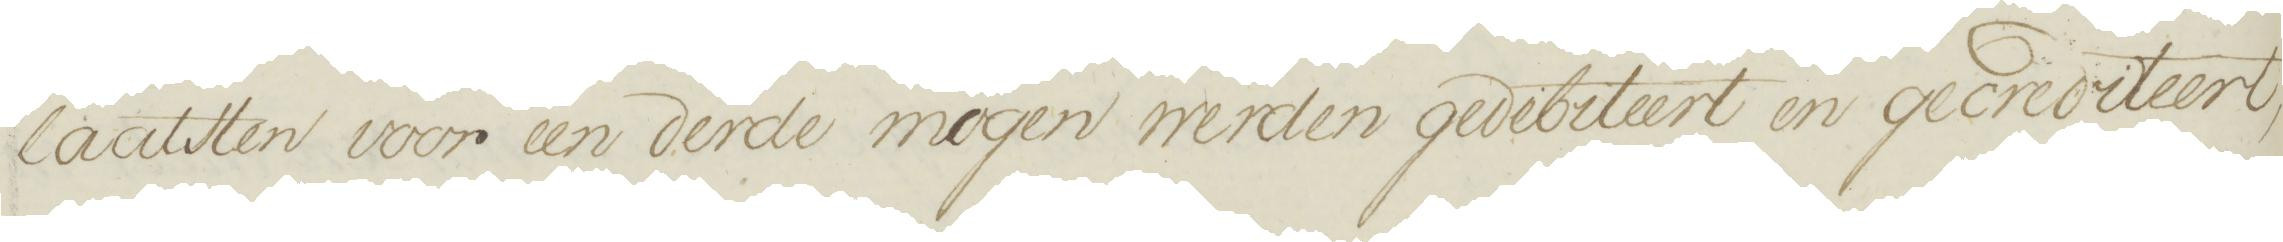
laatsten voor een derde mogen werden gedebiteert en gecrediteert,
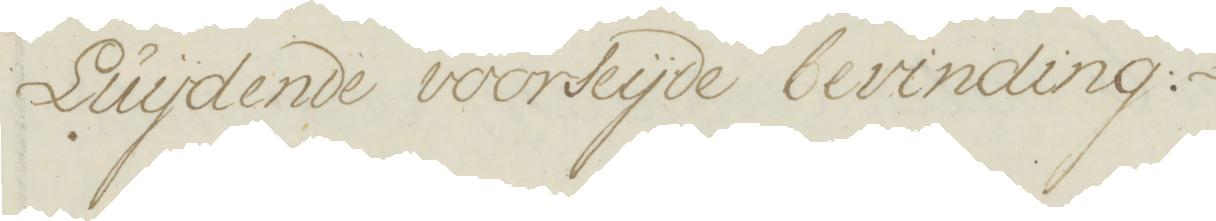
Luijdende voorseijde bevinding:-
